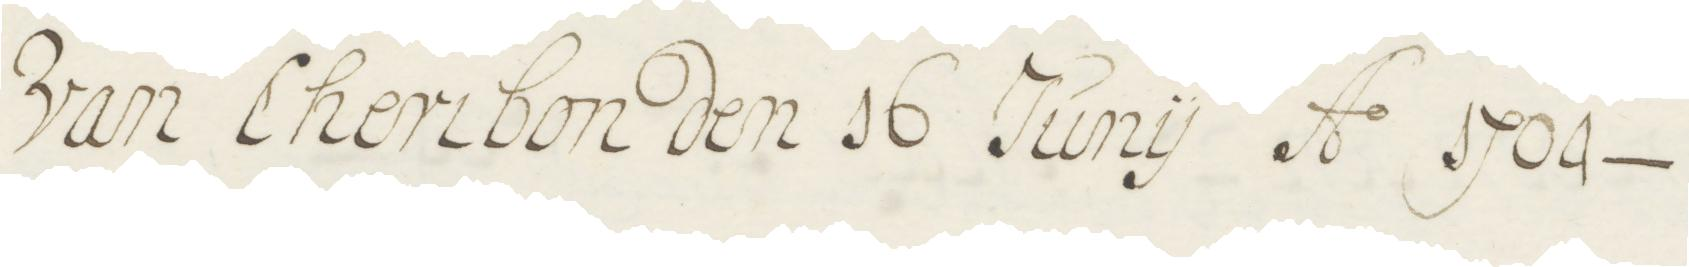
Van Cheribon den 16 Iunij Ao 1704 —
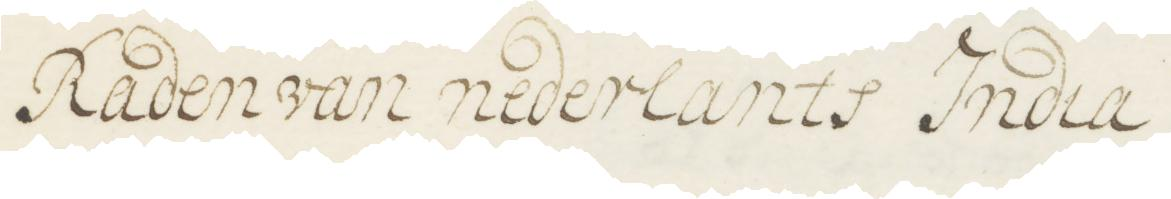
Raden van nederlants India
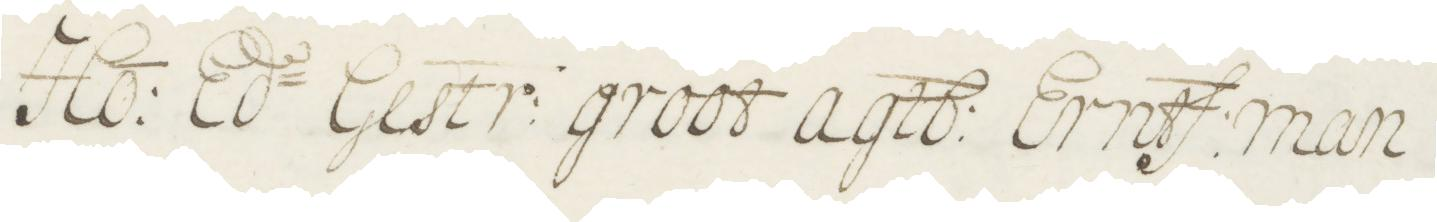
Ho: Ed=e Gestr: groot agtb: Erntf: man
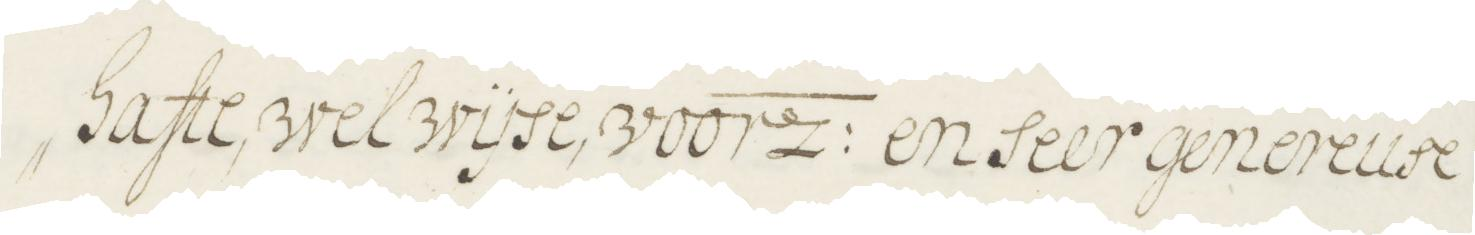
„hafte, wel wijse, voorz: en seer genereuse
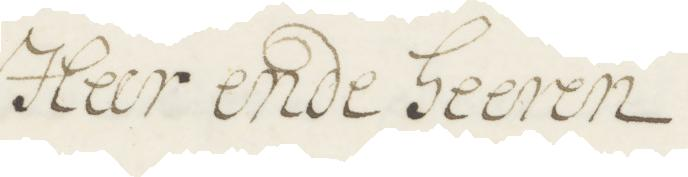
Heer ende heeren
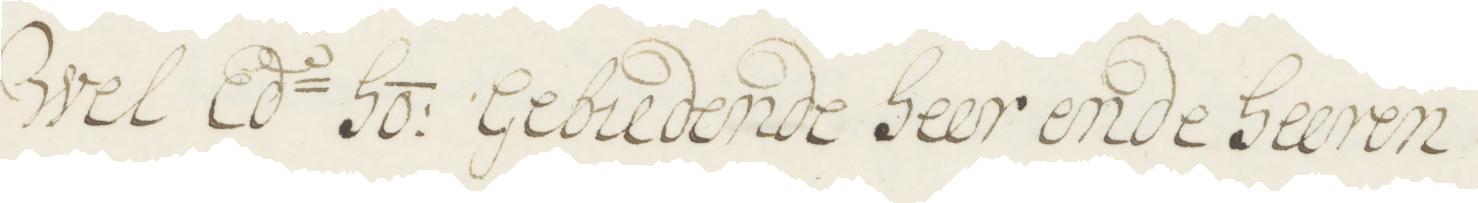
Wel Ed=e Ho: Gebiedende heer ende heeren
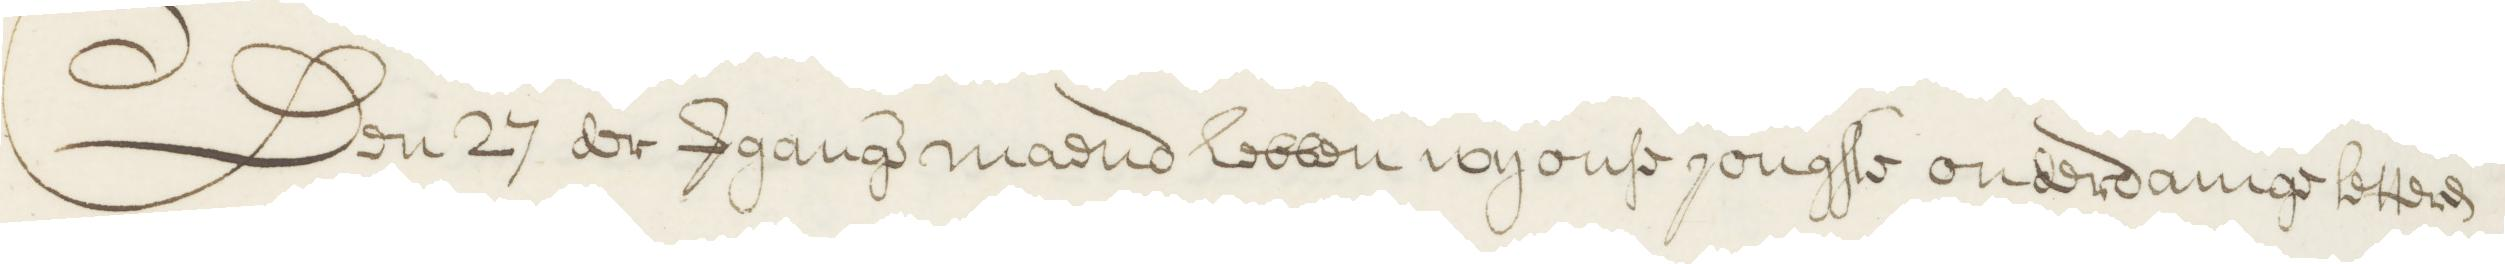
Den 27 der vergange maend hebben wy onse jongste onderdanige letteren
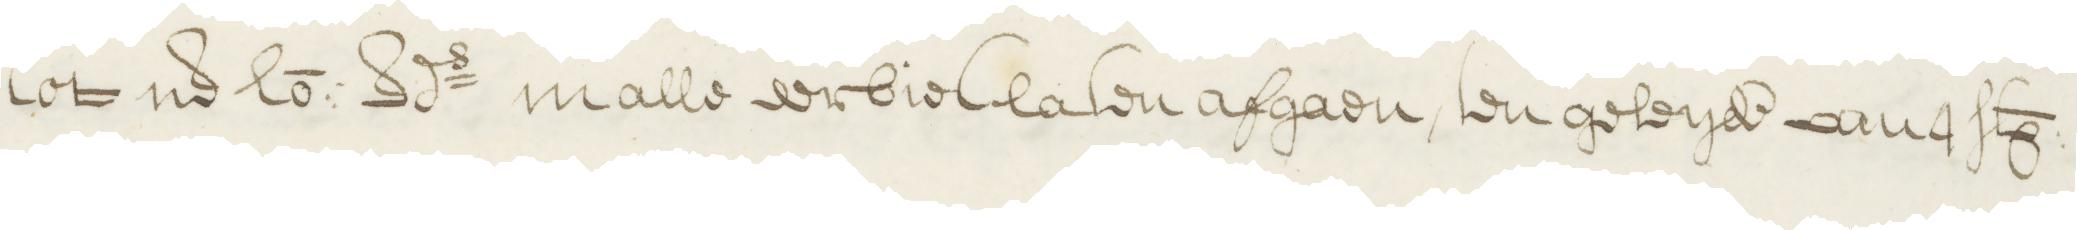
tot uE ho: Ed=s in alle eerbiet laten afgaen, ten geleyde van 4 stx:
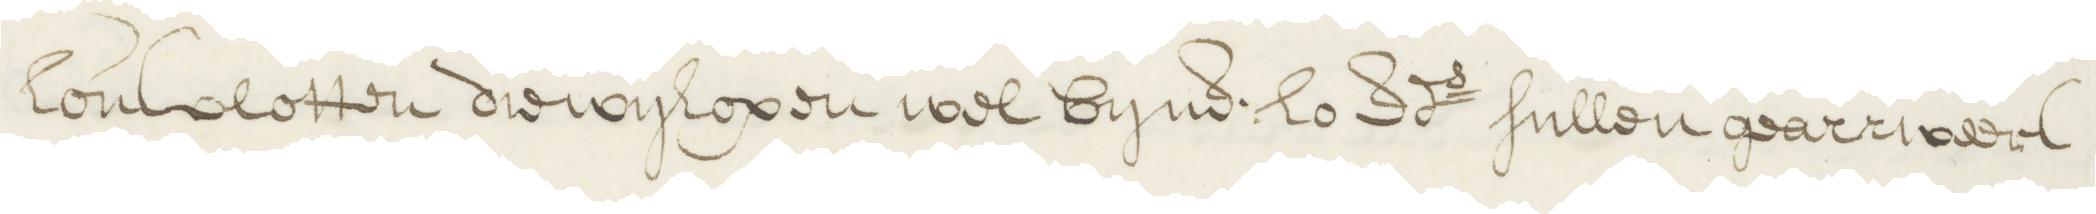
houtvlotten die wy hopen wel by uE: ho Ed=s sullen gearriveert
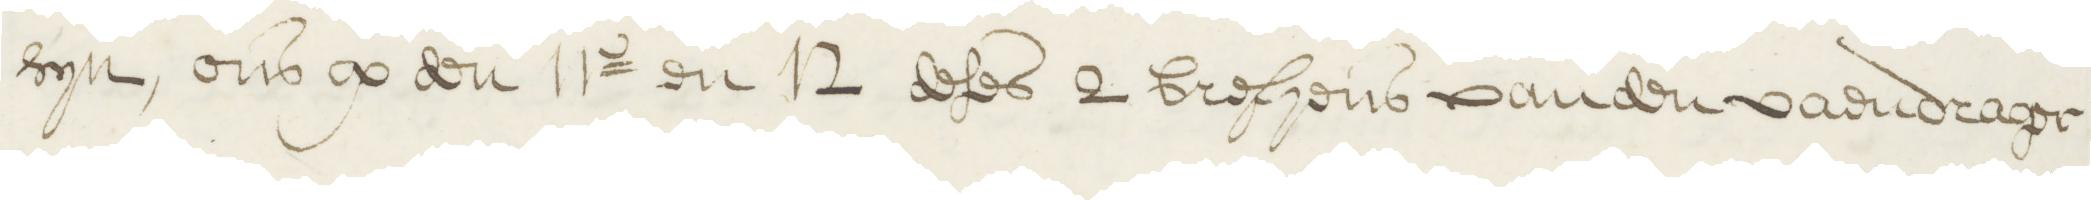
syn, ons op den 11=' en 12 deses 2 brefjens van den vaendrager
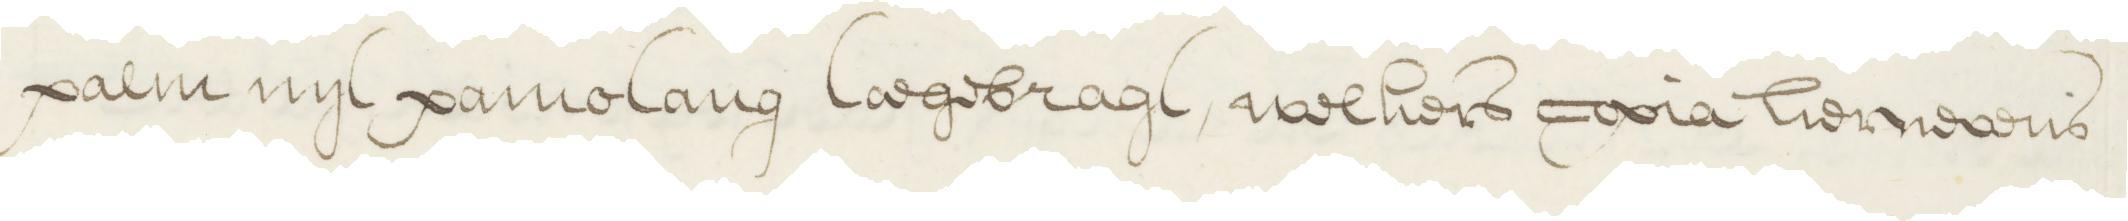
palm uyt pamotang toegebragt, welkers copia hiernevens
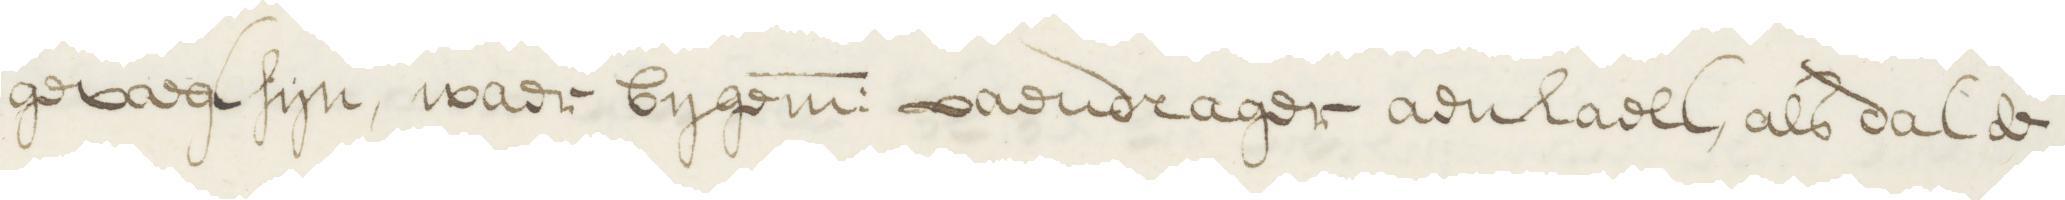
gevoegt sijn, waer by gem: vaendrager aenhaelt, als dat de
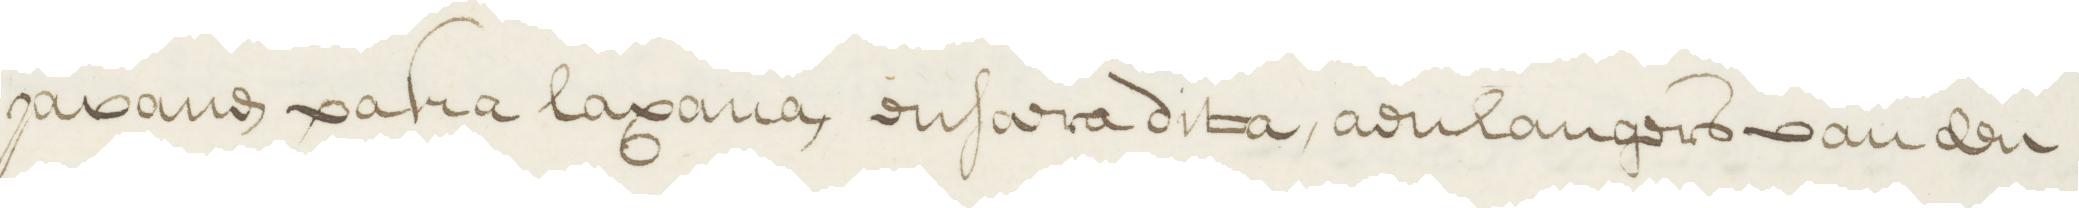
javanen patra laxana, en soera dita, aenhangers van den
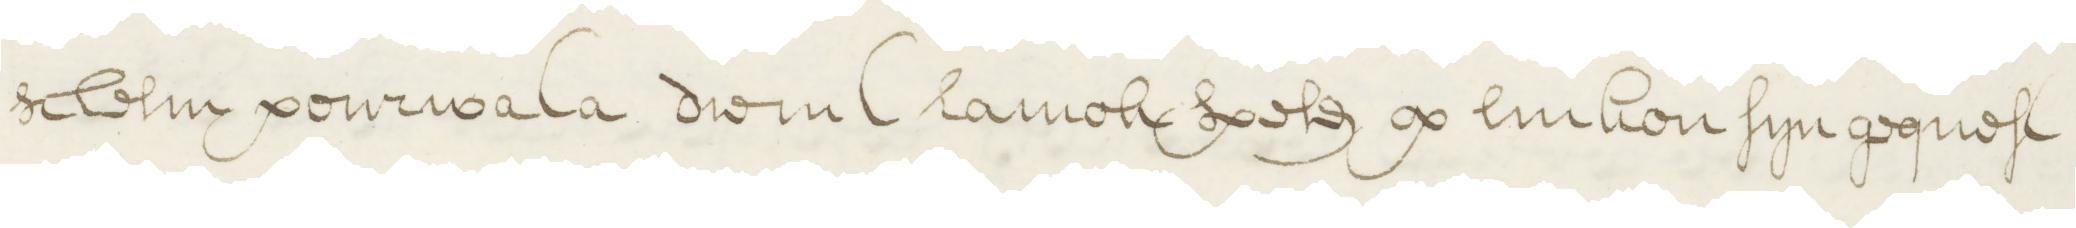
schelm pourwata die in t hamok spelen op linkon syn gequest
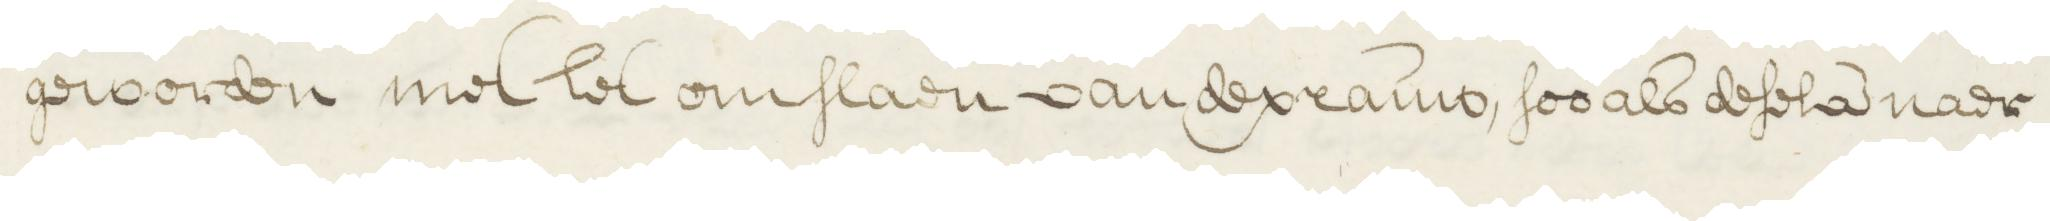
geworden met het omslaen van de prauw, soo als deselve naer
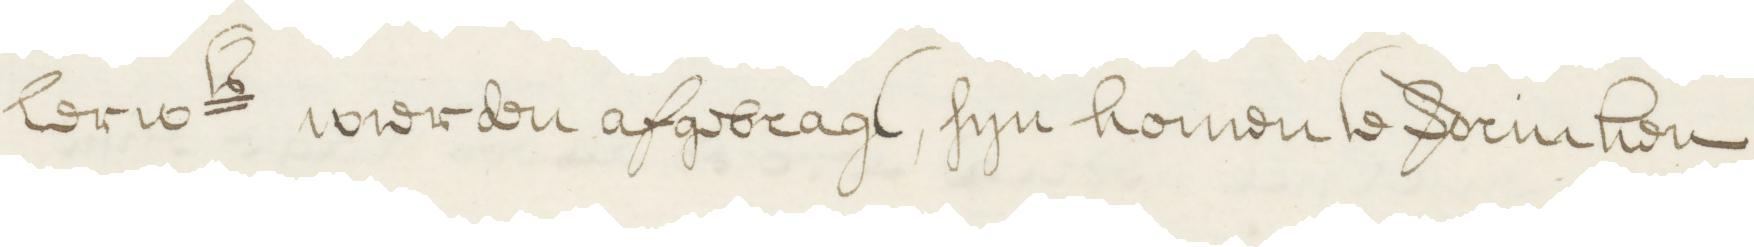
herw=ts wierden afgebragt, syn komen te verdrinken
